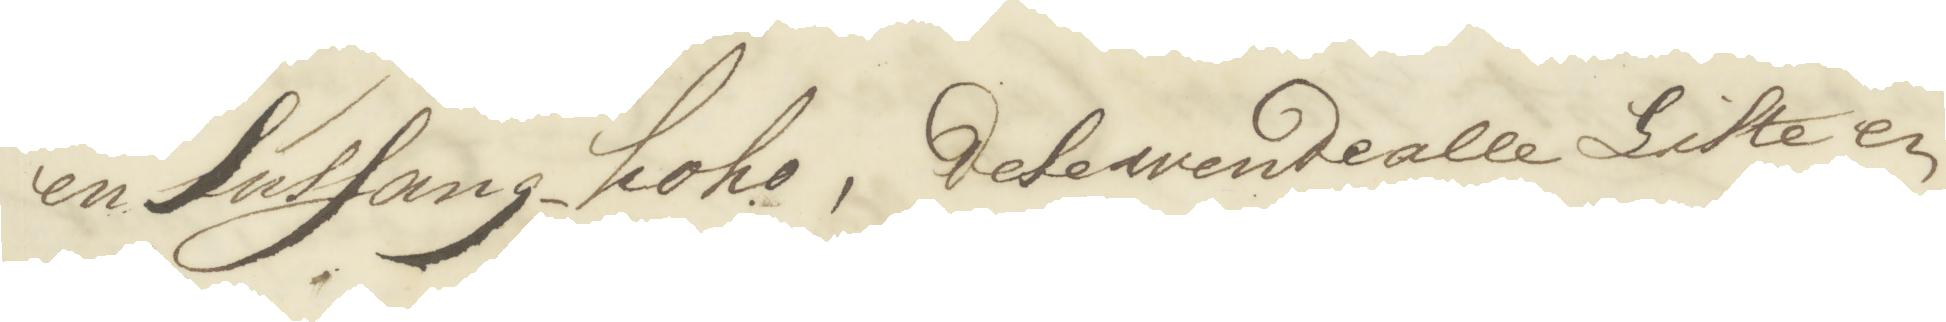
en sussang-koko, dese wende alle liste en
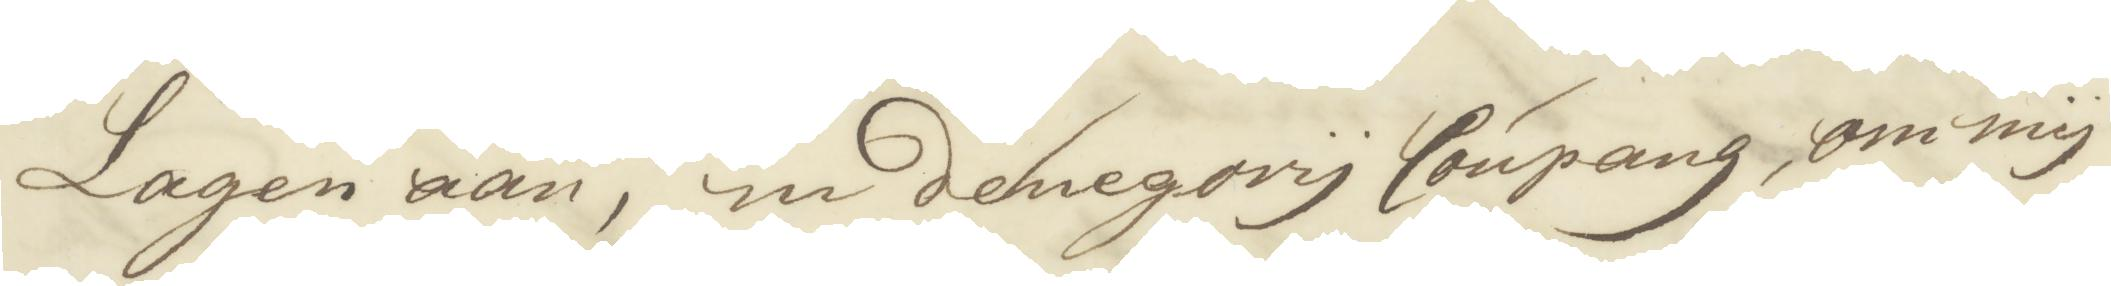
Lagen aan, in de negorij Coupang, om mij
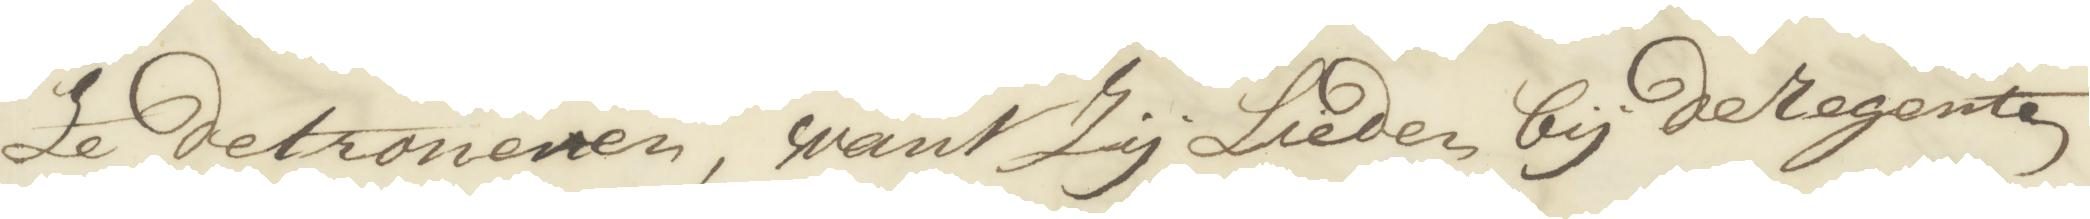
te detroneren, want zij Lieden bij de regenten
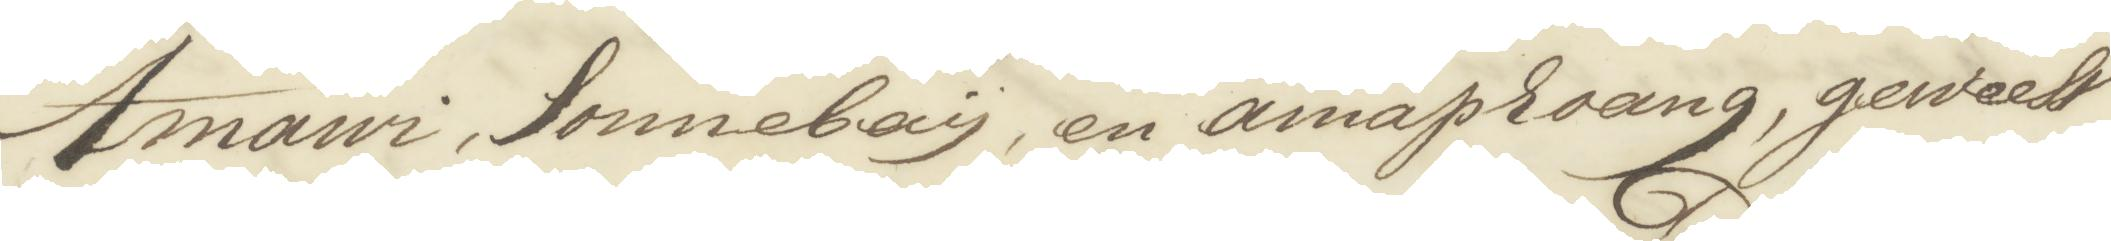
Amawi, sonnebaij, en amaphoang, geweest
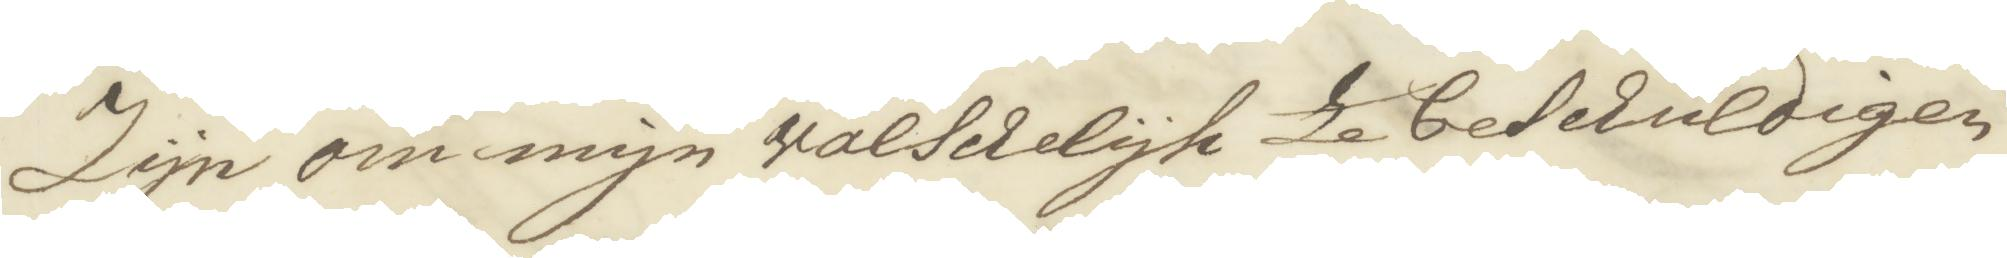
zijn om mijn valschelijk te beschuldigen
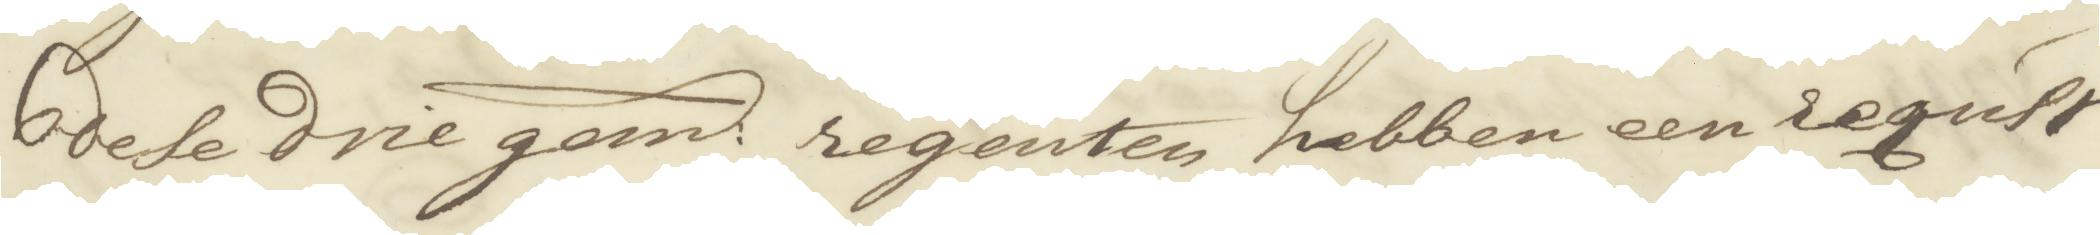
dese drie gem: regenten hebben een requst
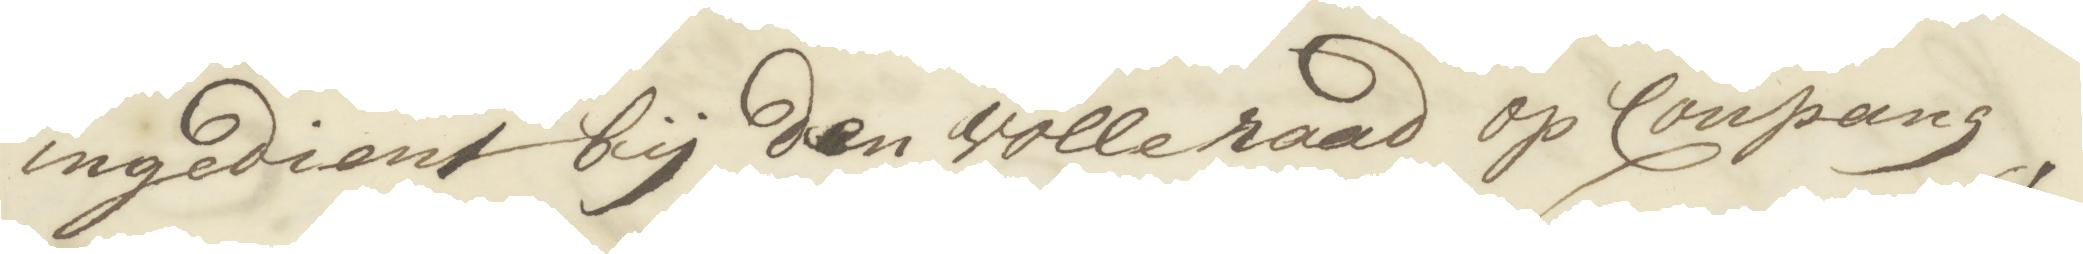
ingedient bij den volle raad op Coupang,
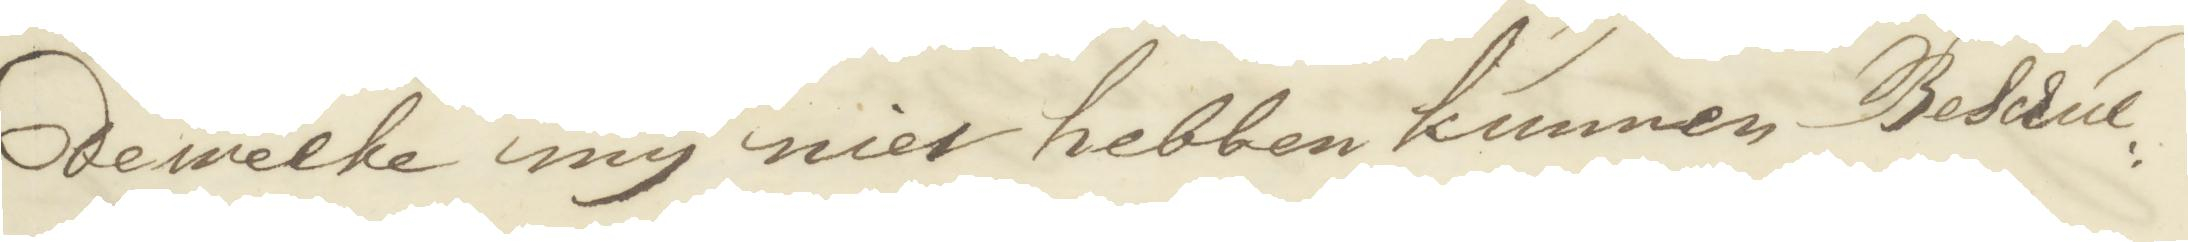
dewelke mij niet hebben kunnen Beschul„
